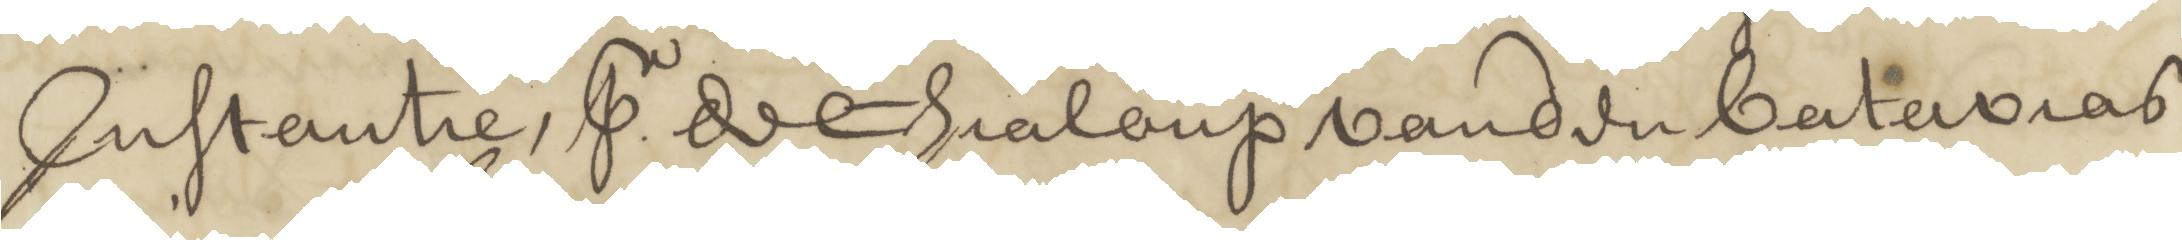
Jnstantie, p.r de chialoup van den batavias
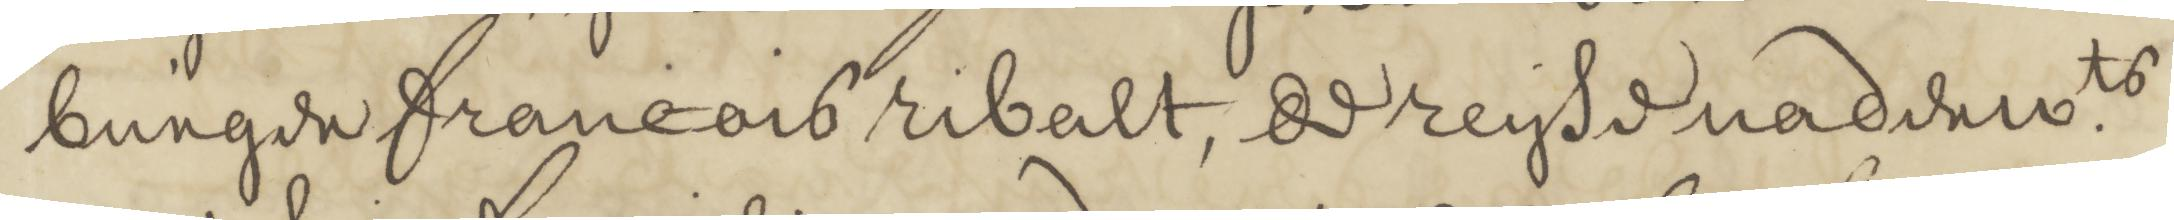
burger francois ribalt, de reijse na derw. ts
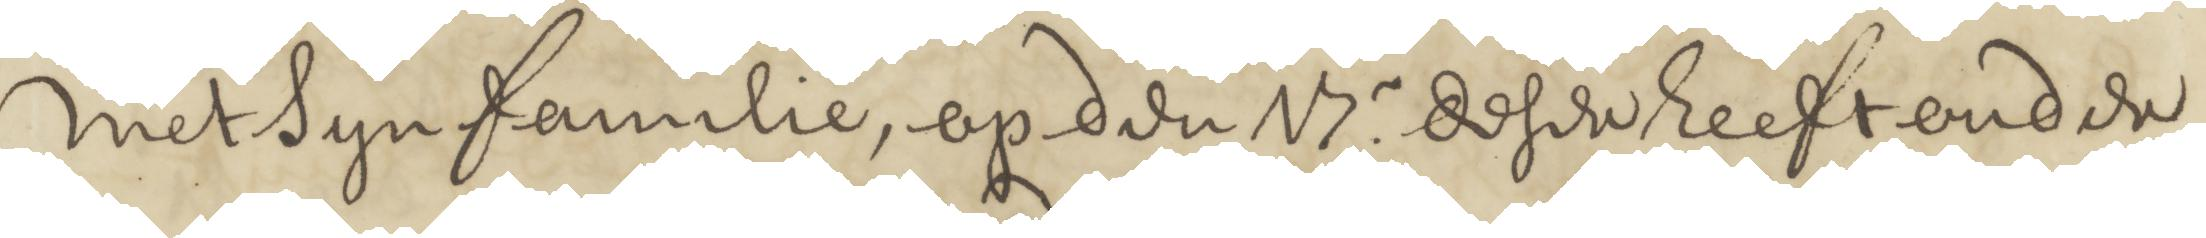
met Sijn familie, op den 17.' deser heeft onder
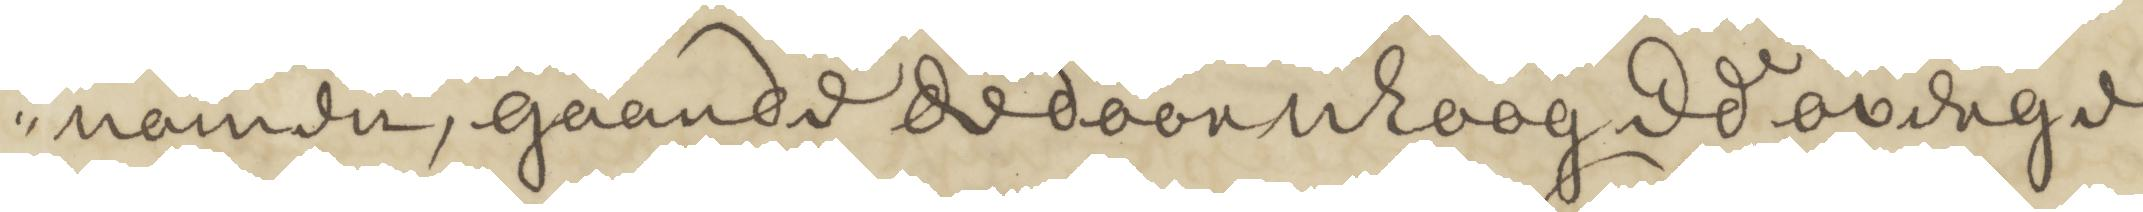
„ nomen, gaande de door uhoog Ed:e overge
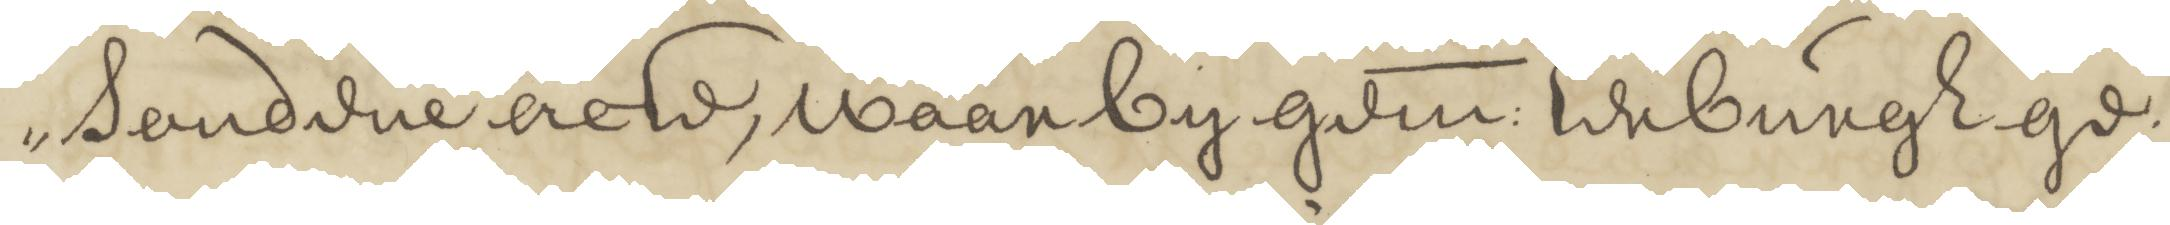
„Sondene acte, waar bij gem: terburgh ge.
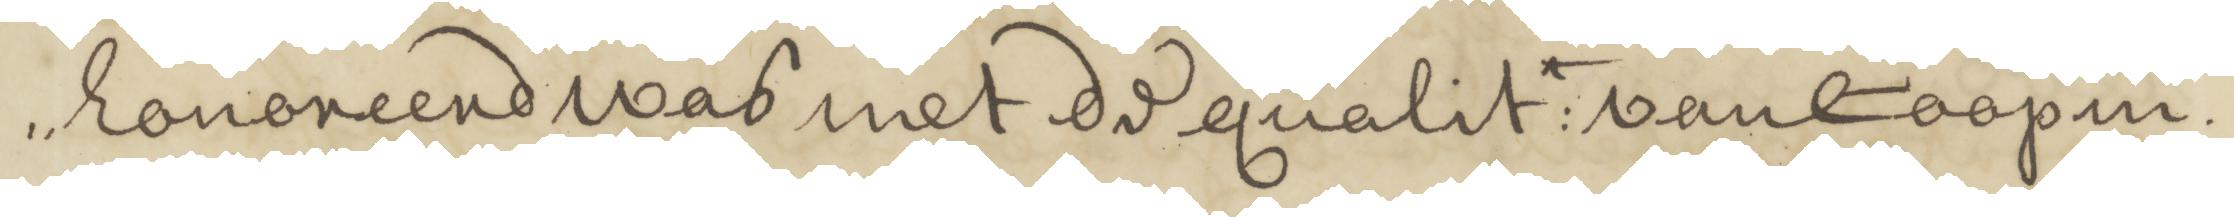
„honoreerd was met de qualit:t van Coopm.
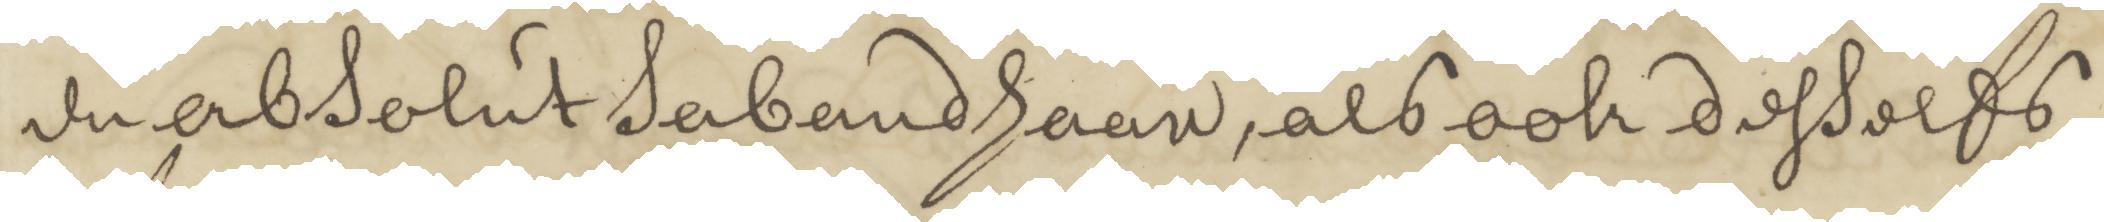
en absolut Sabandhaar, als ook desselfs
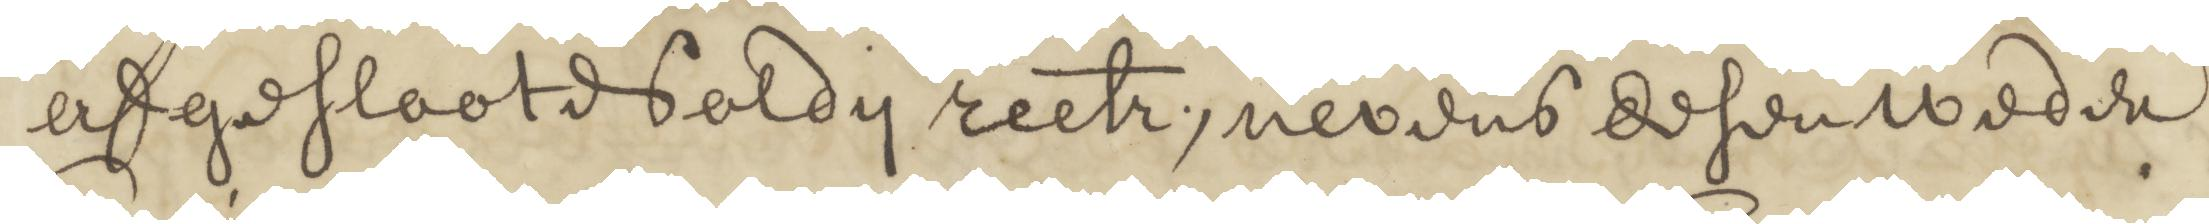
afgeslootesoldij reek., nevens desen weder
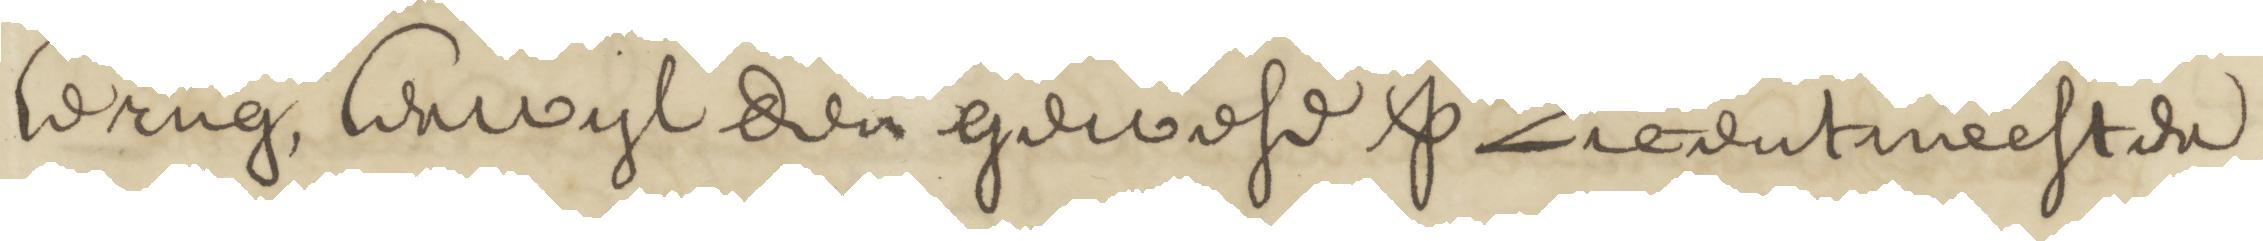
terug, terwijl den gewese p:l Licentmeester
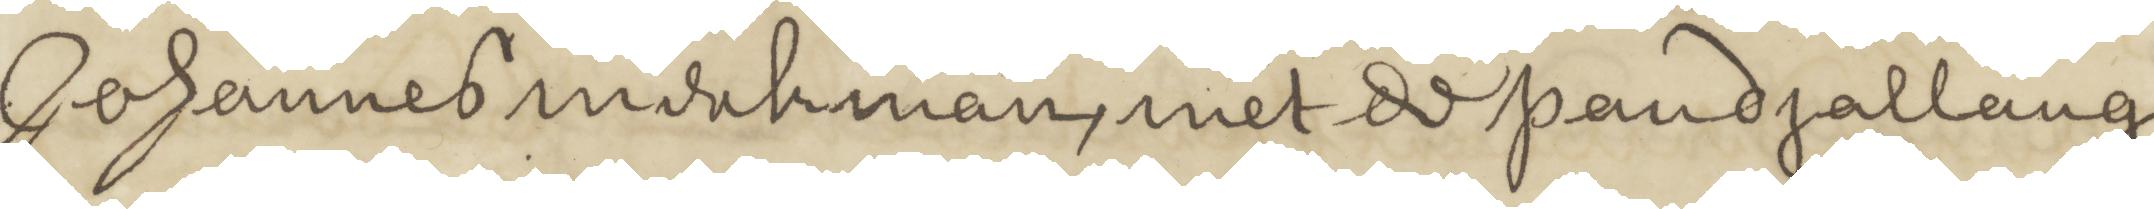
Johannes merkman, met de pandjallang
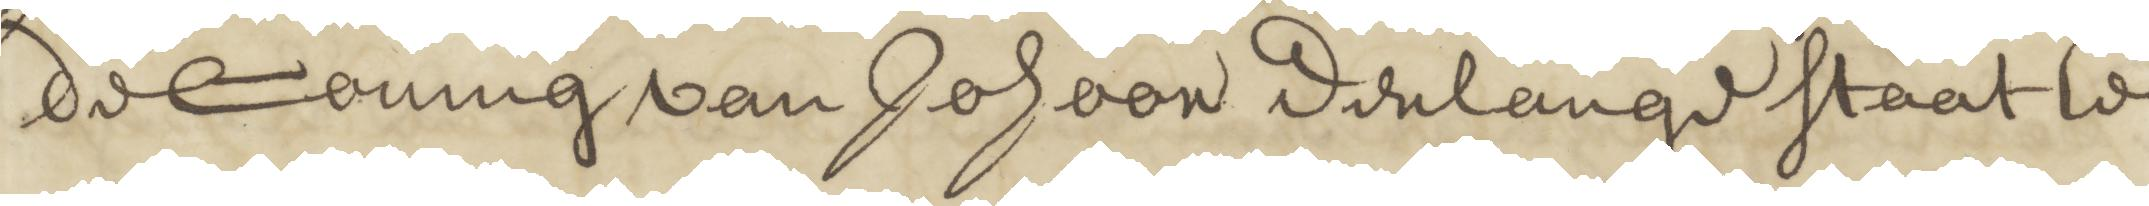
de Coning van Johoor Eerlange staat te
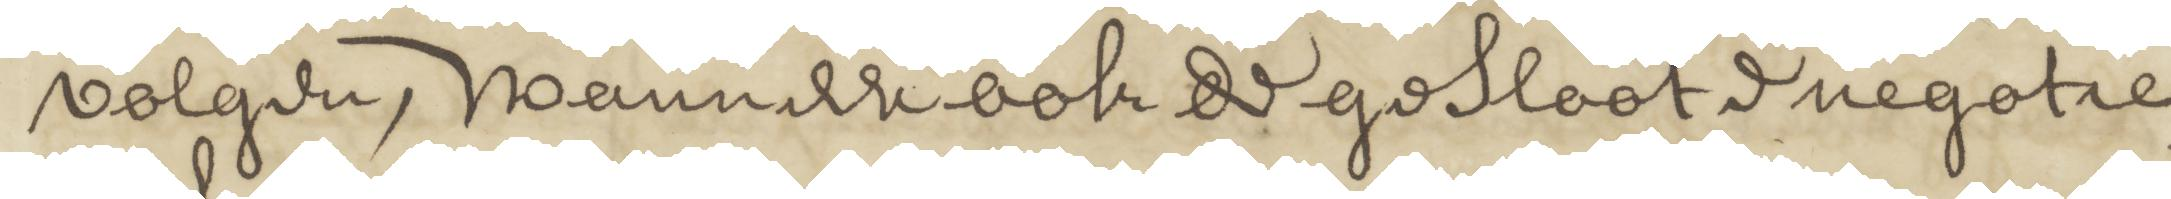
volgen, wanneer ook de gesloot e negotie
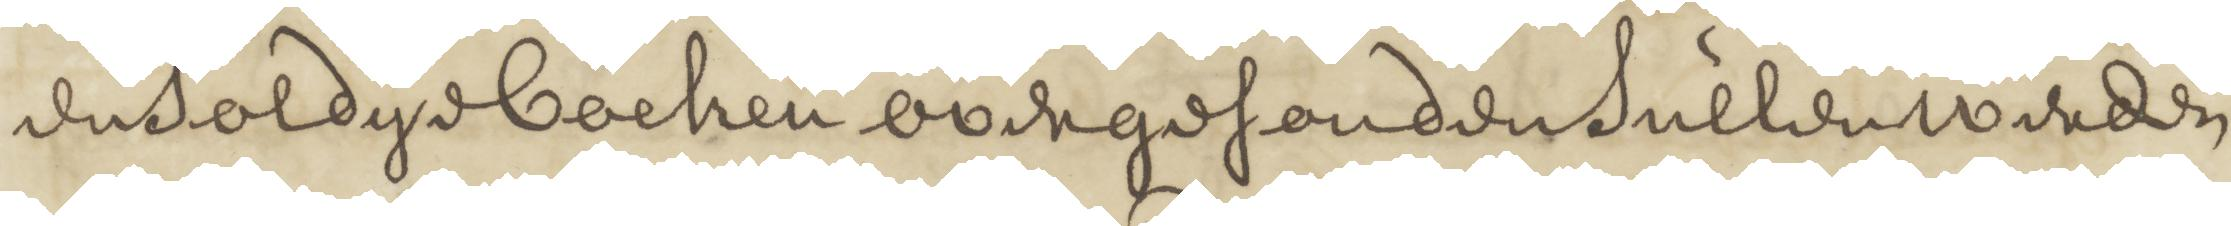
en Soldijeboeken overgesondenSullenwerden
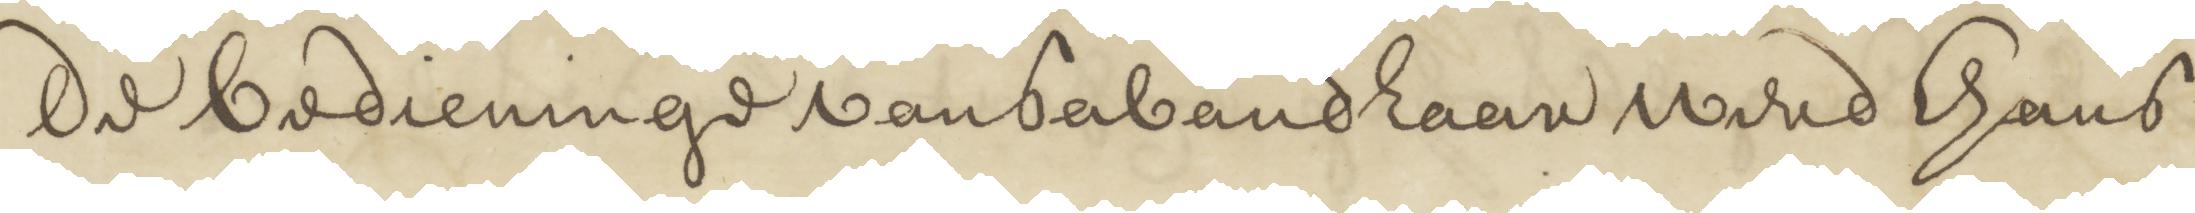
de bedieninge van saband haar werd thans
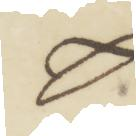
p
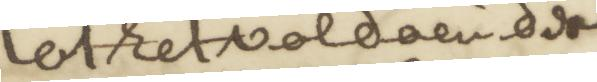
tot het voldoen der
